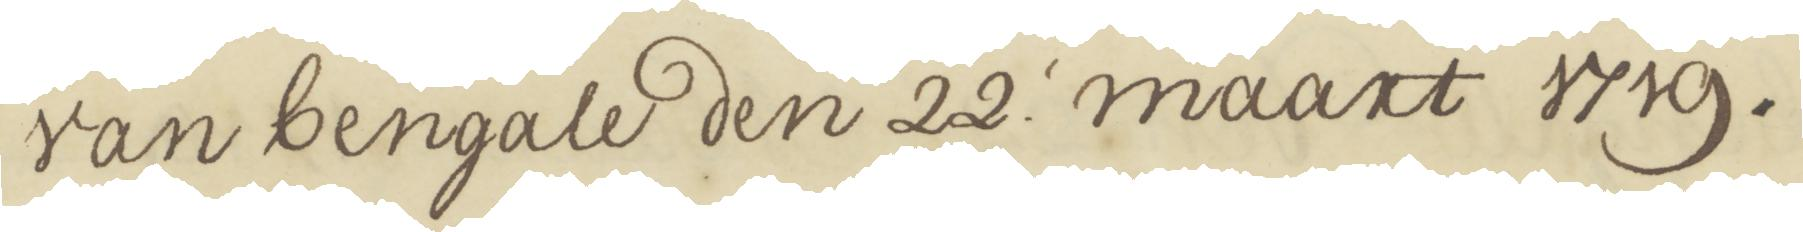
van bengale den 22:' maart 1719.
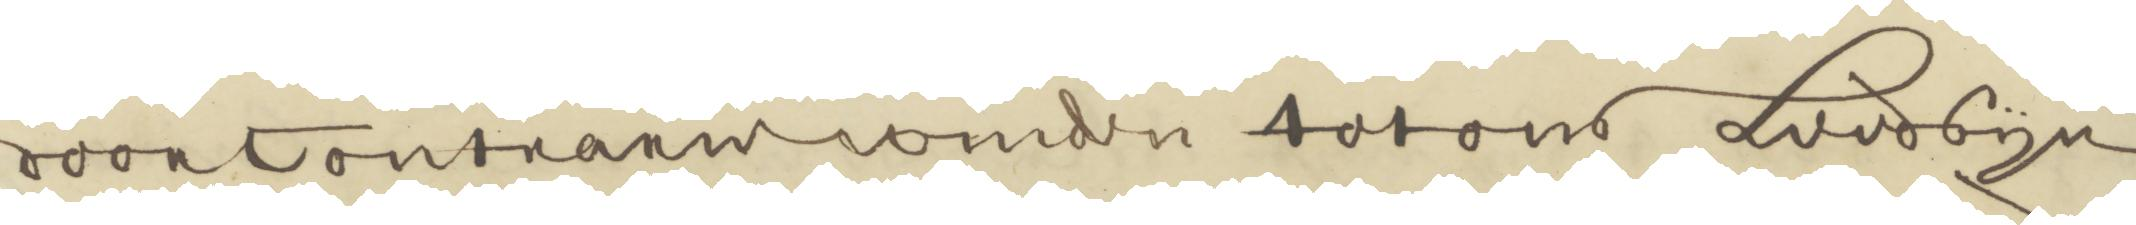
door contrarie winden tot ons Leed sijn
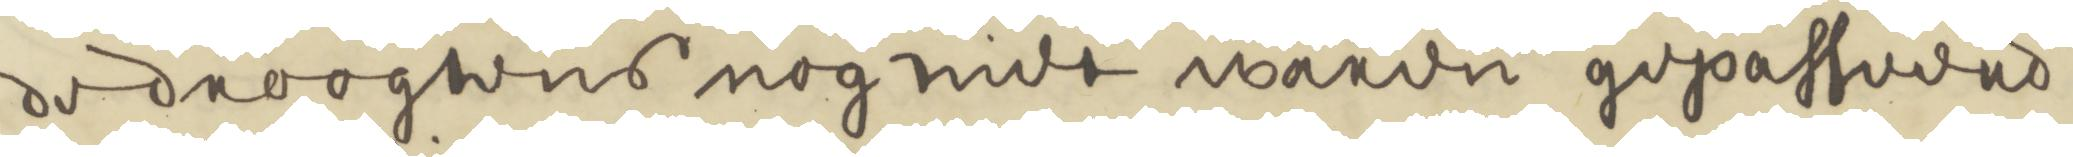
de droogtens nog niet waren gepasseerd
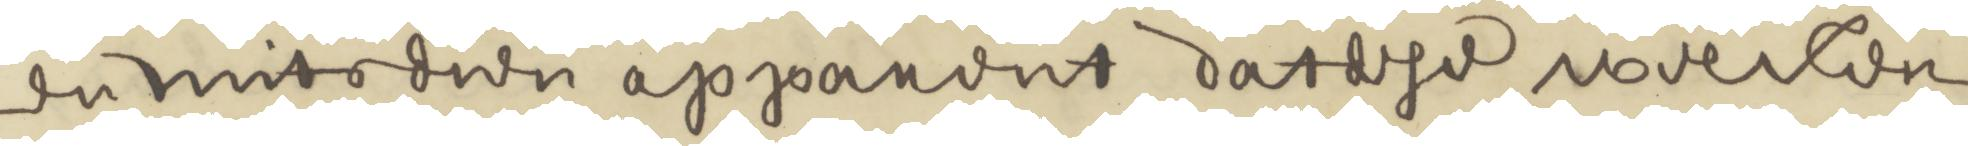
en mitsdien apparent dat dese wel Een
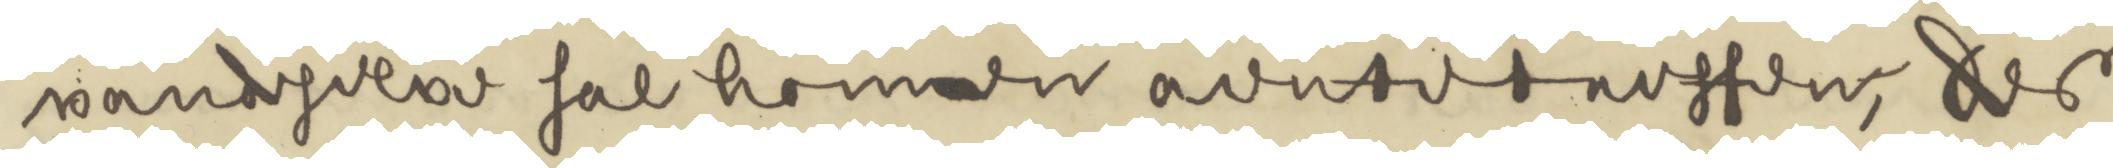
van deselve sal komen aen te treffen, des
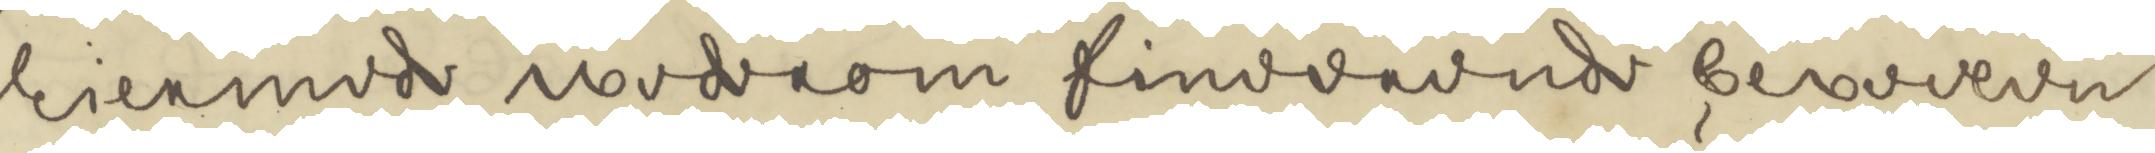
hiermede wederom fineerende beveelen
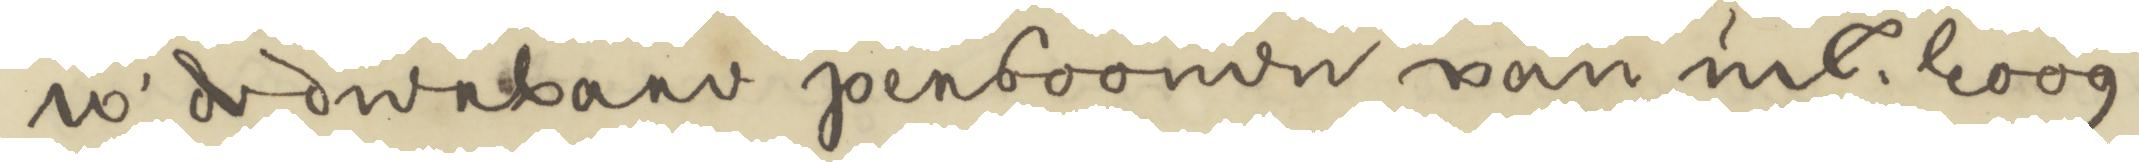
w' de dierbare persoonen van uE. hoog
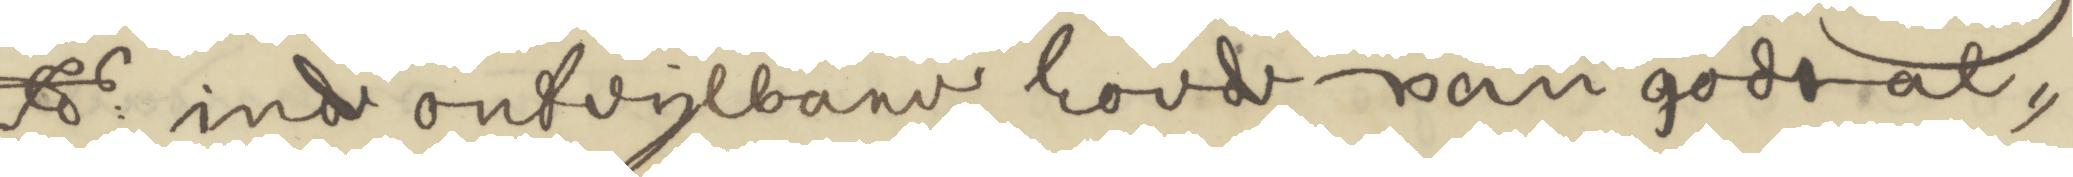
Ed:s inde onfeijlbare hoede van godt al„
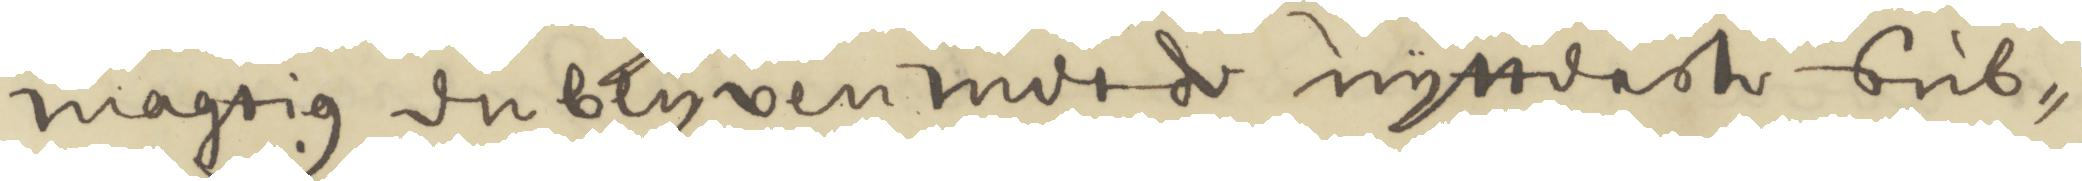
magtig en blijven met de uijtterste sub„
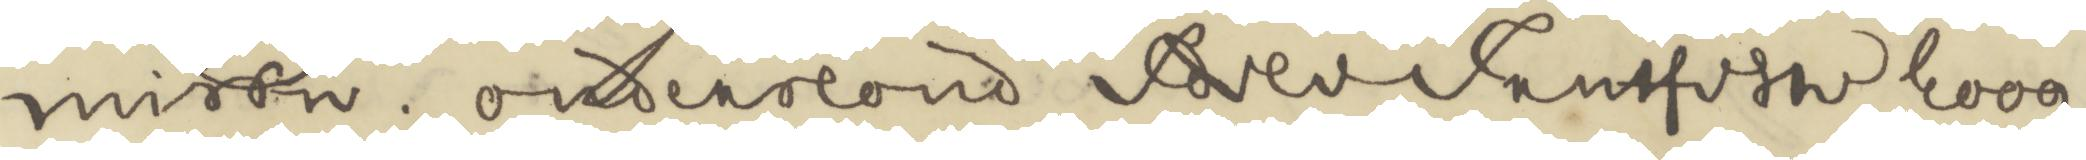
missie. onderstond Edele Erntfeste hoog
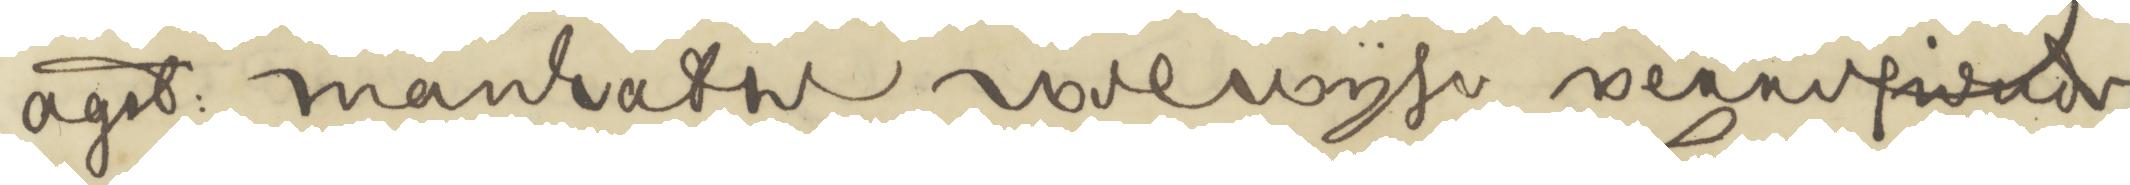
agtb: manhafte wel wijse verresiende
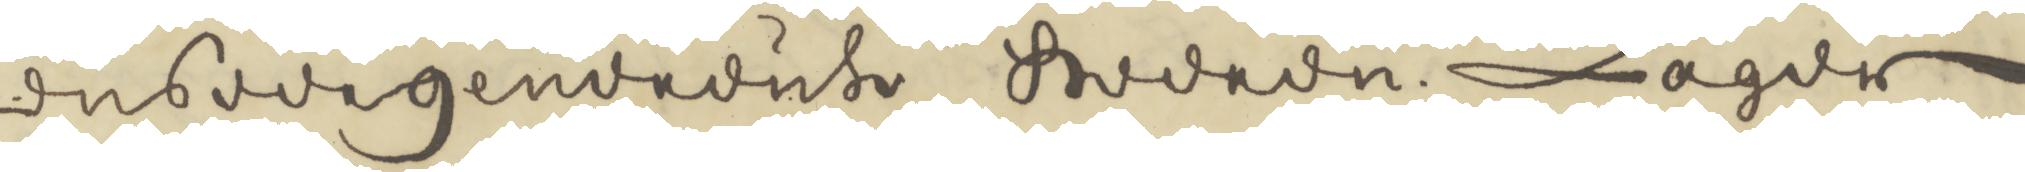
en seer genereuse Heeren. Lager
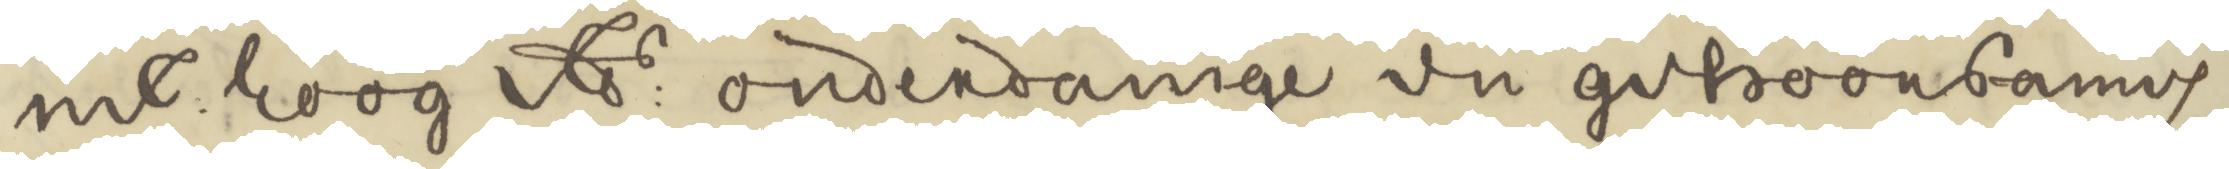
uE: hoog Ed:s onderdanige en gehoorsamen
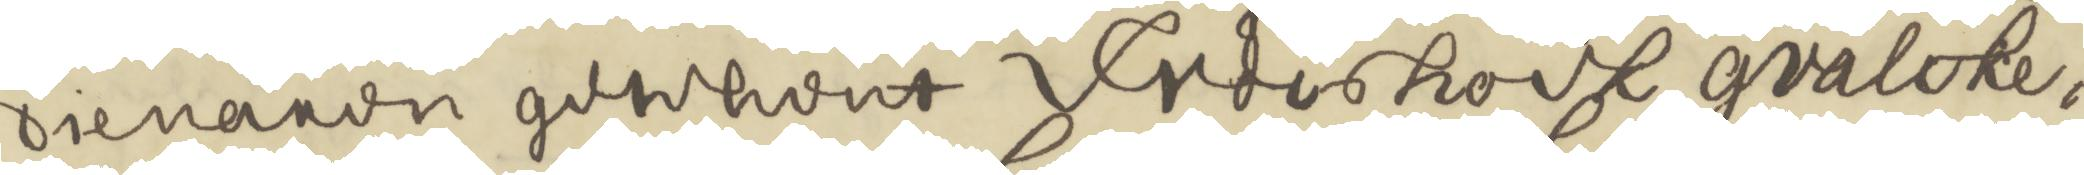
dienaren getekent Erdishoek, g valcke„
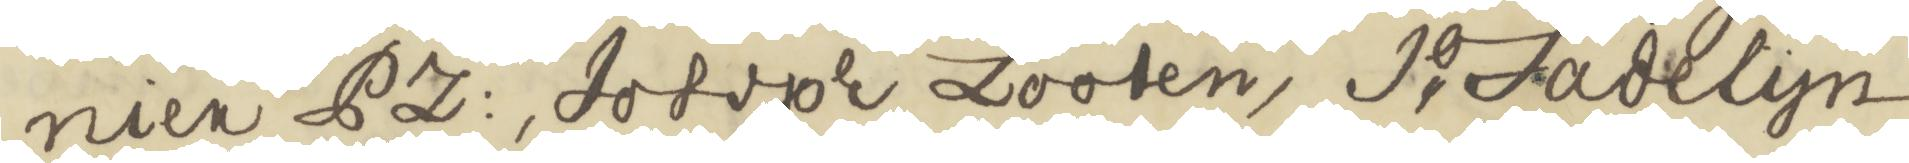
nier Pz:, Ioseph Looten, I„b Sadelijn
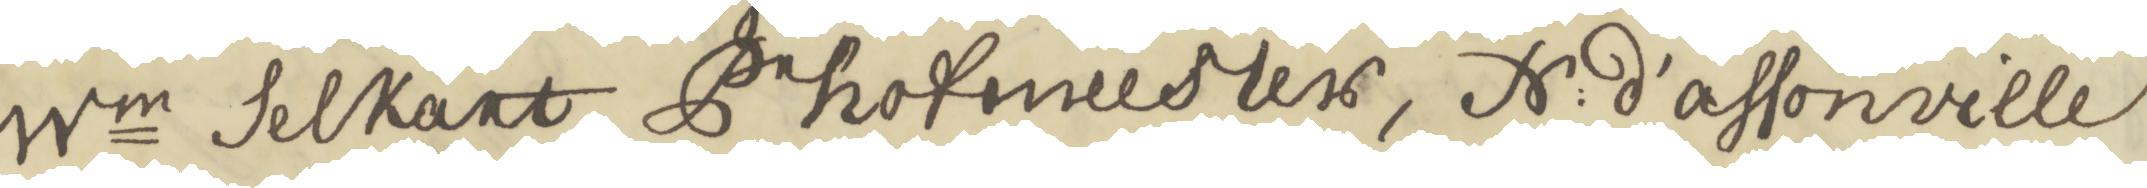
W=m selkart Pr hofmeester, N: d’assonville
